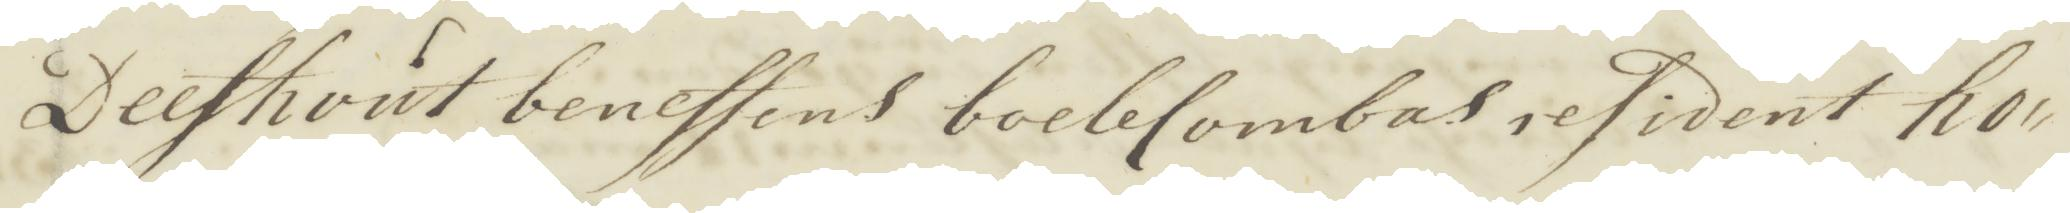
Delfhout beneffens boelecombas resident ho„
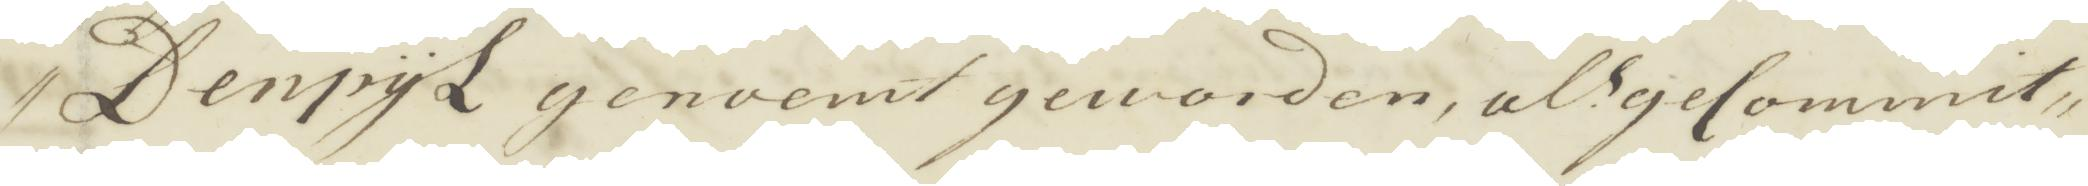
„Denpijl genoemt geworden, als gecommit„
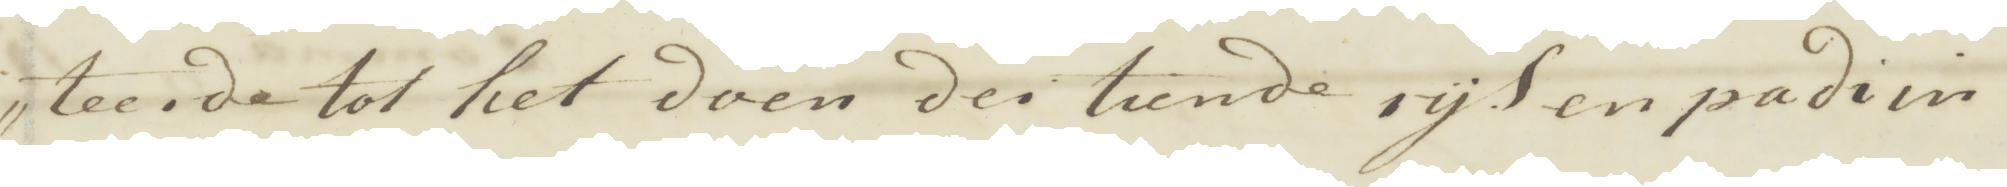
„teerde tot het doen der tiende rijs en padi in
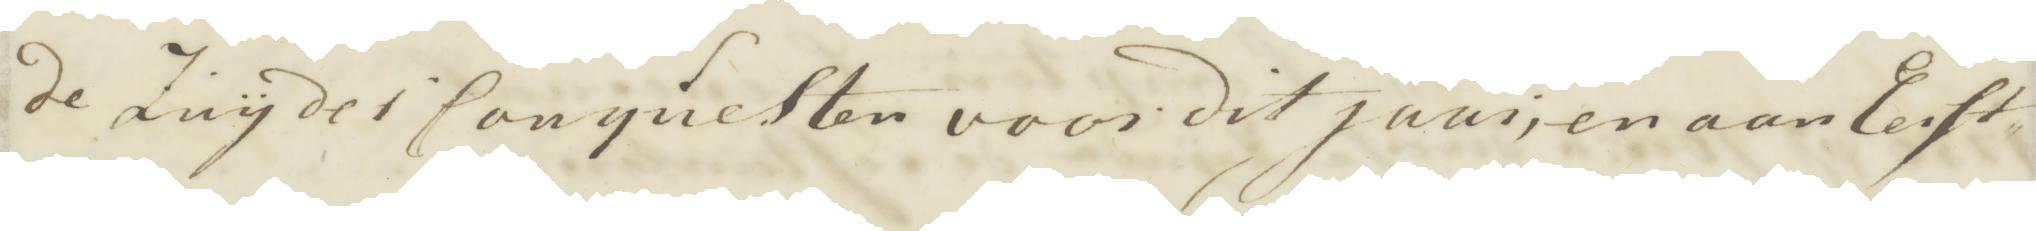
de Zuijder Conquesten voor dit jaar; en aan Eerst„
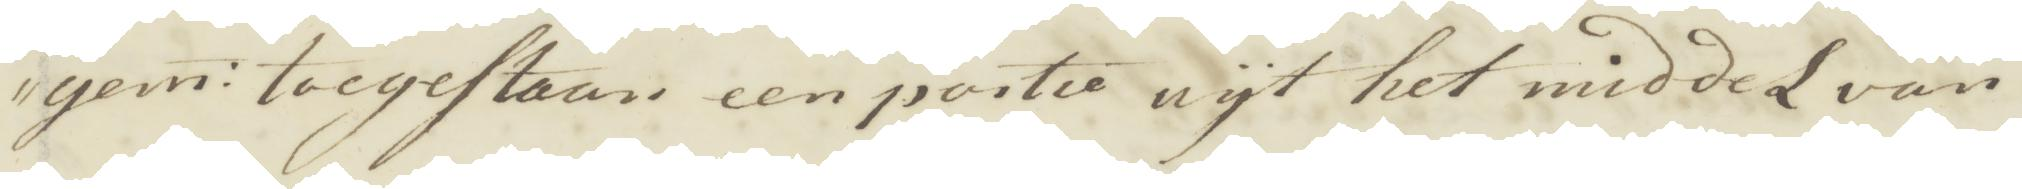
„gem: toegestaan een portie uijt het middel van
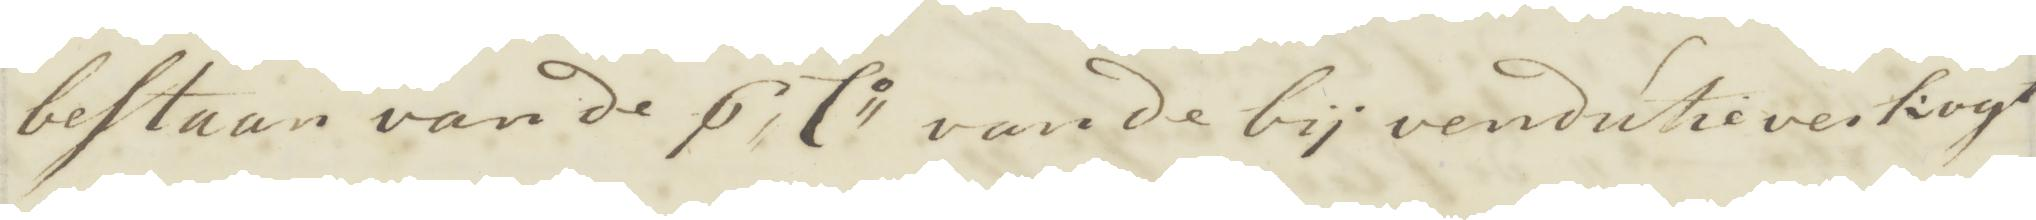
bestaan van de p„r C„o van de bij vendutie verkogt
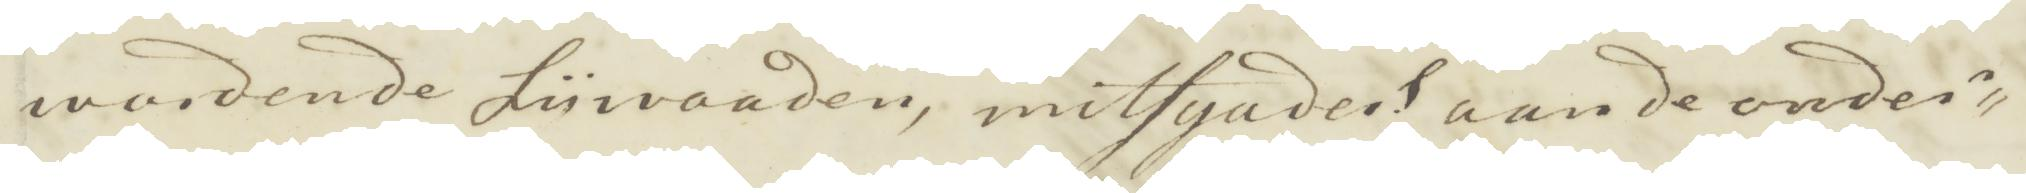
wordende lijwaaden, mitsgaders aan de onder„
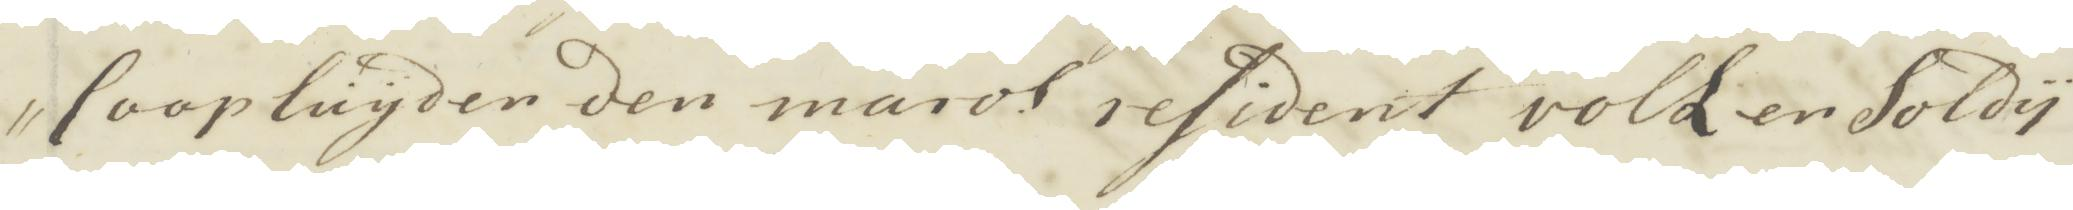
„coopluijden den maros resident voll en soldij
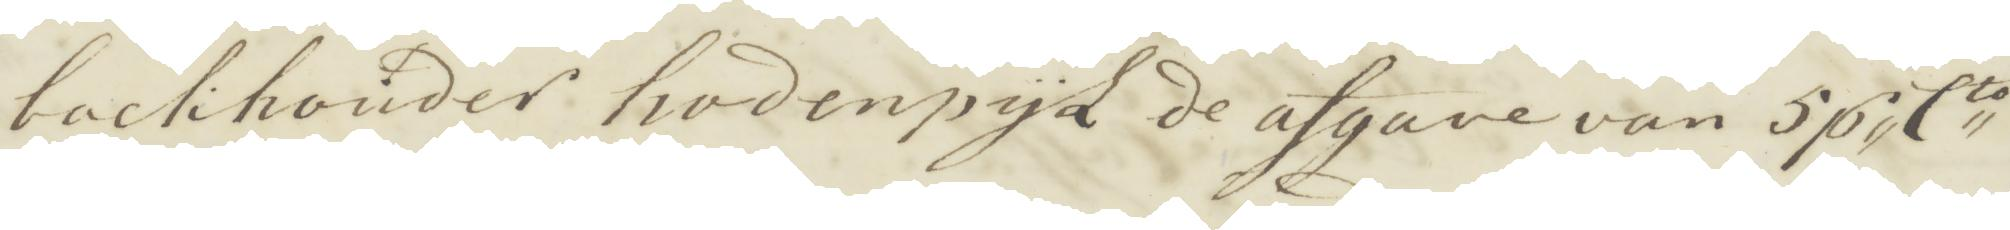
boekhouder hodenpijl de afgave van 5 p„rC„to
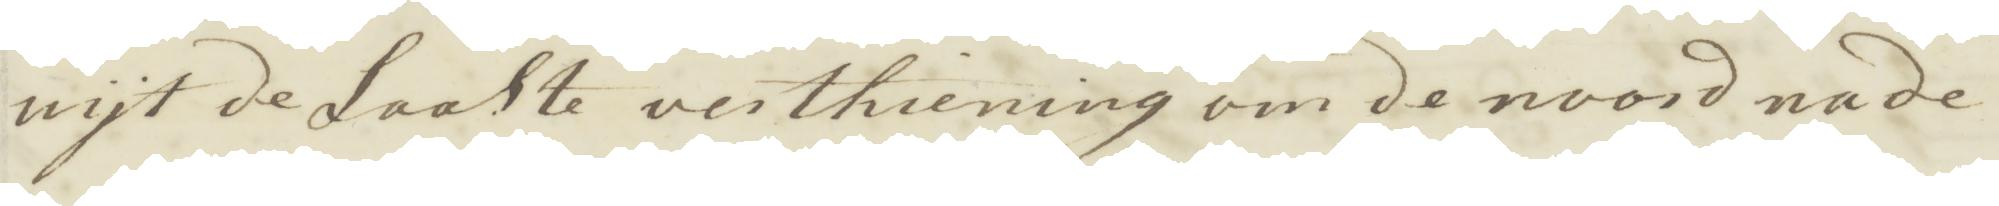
uijt de Laaste verthiening om de noord na de
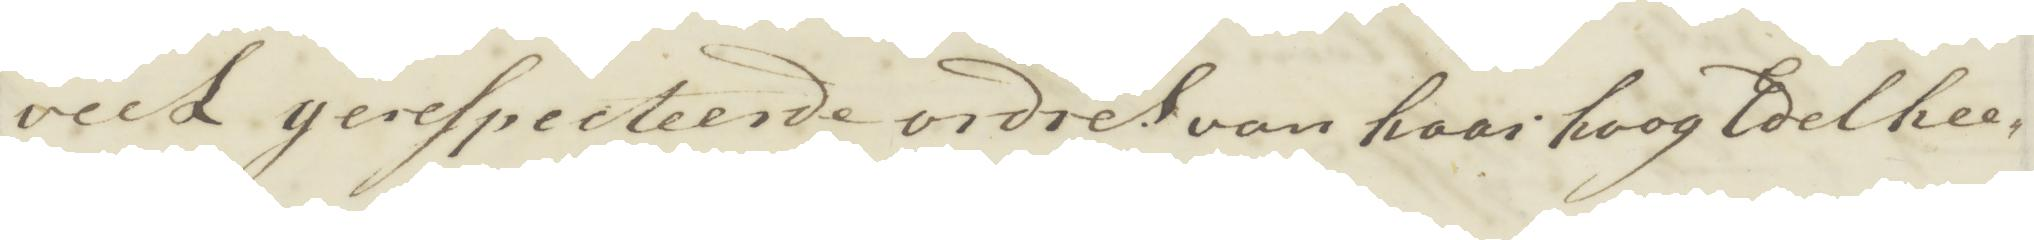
veel gerespecteerde ordres van haar hoog Edelhee„
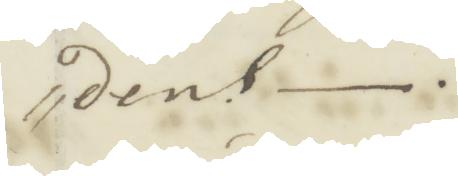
„dens—.
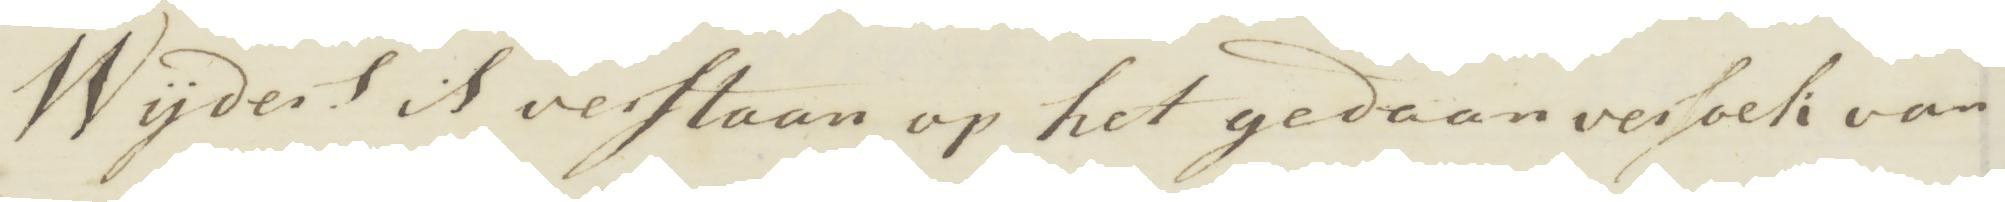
Wijders is verstaan op het gedaan versoek van
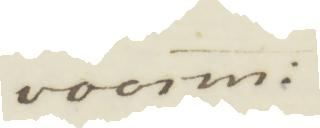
voorm:
